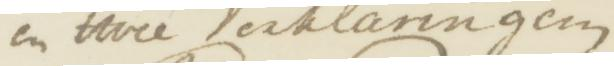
en twee Verklaringen
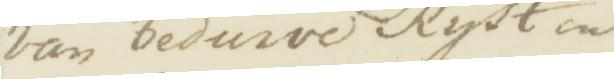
van bedurve Ryst en
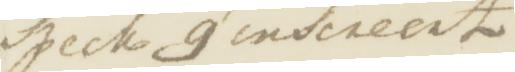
speck g’insereert
